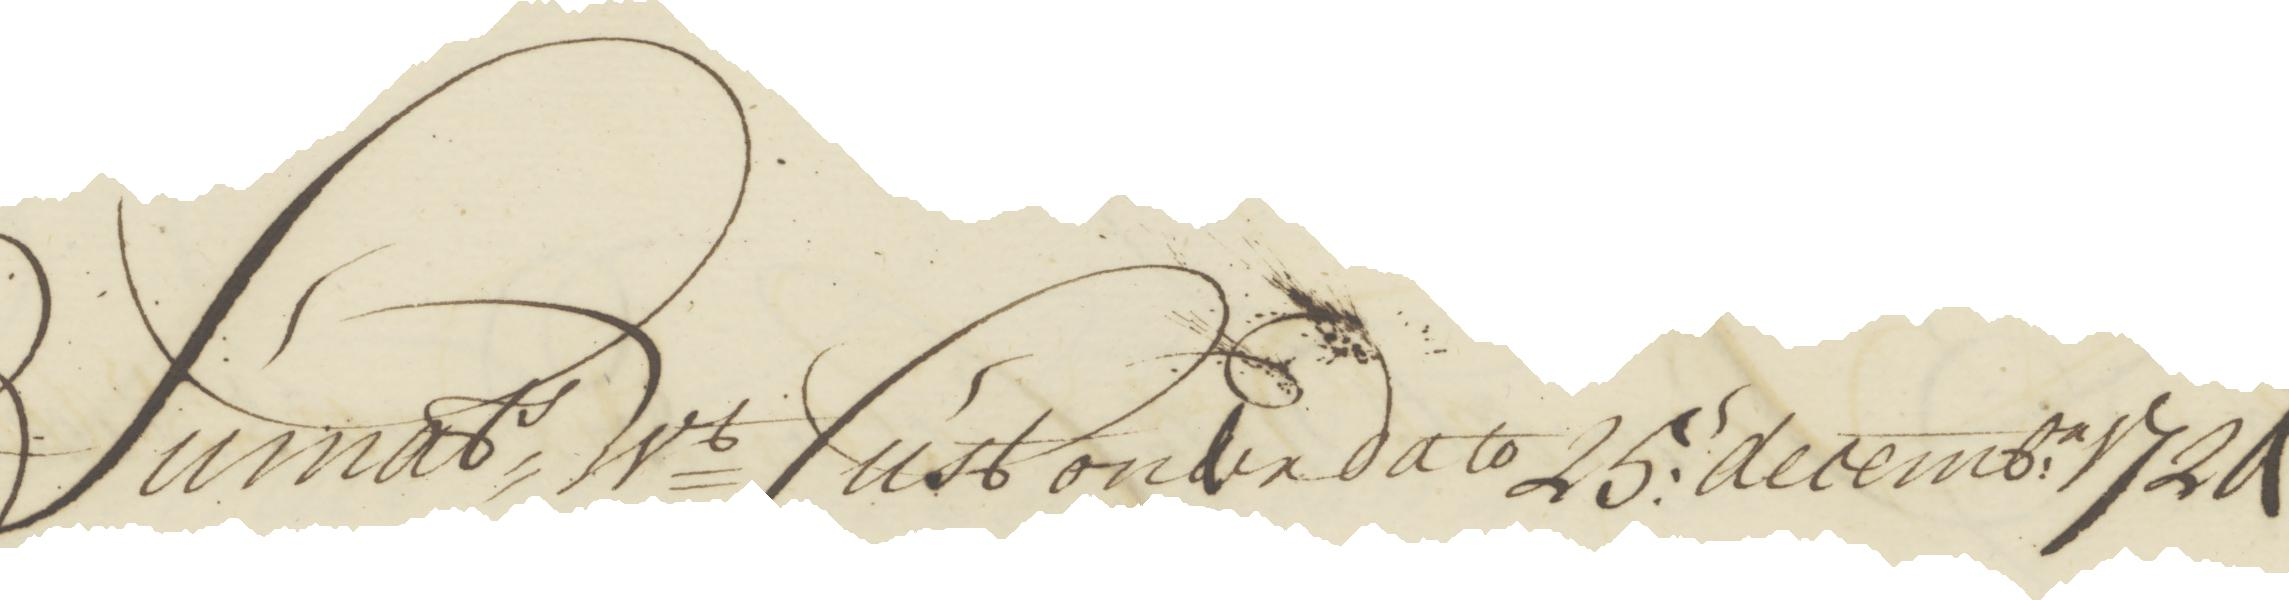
Sumat„s W=t: Cust onder dato 25:' decemb:r 1724
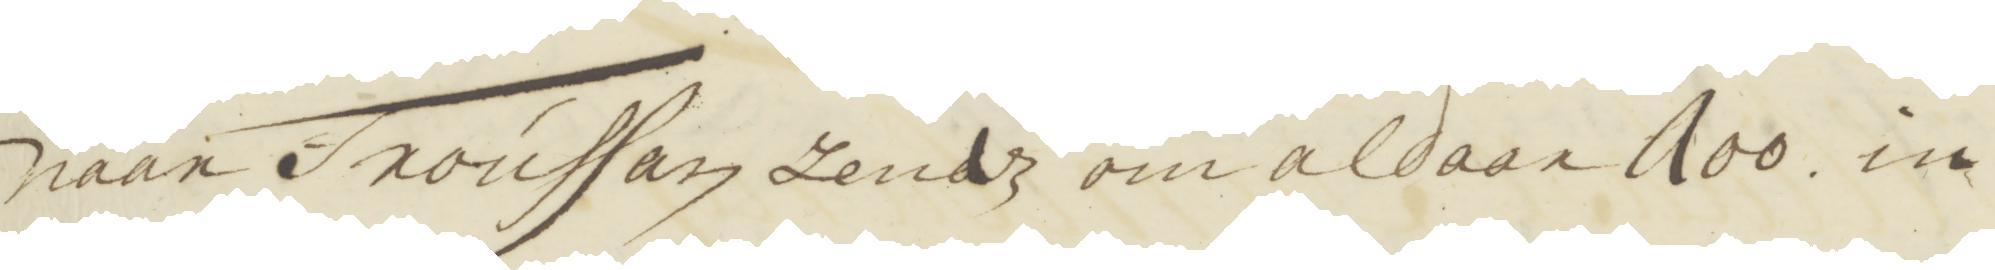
naar Troussan zenden om aldaar 400. in
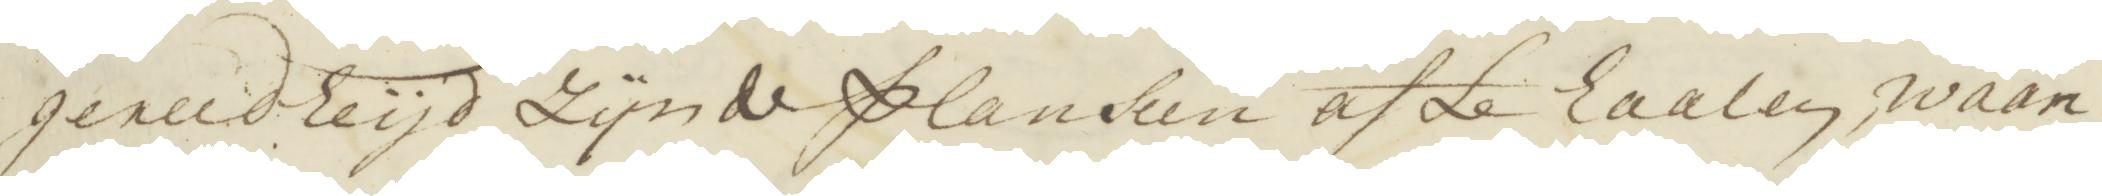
gereedheijd zijnde planken af de haalen, waar
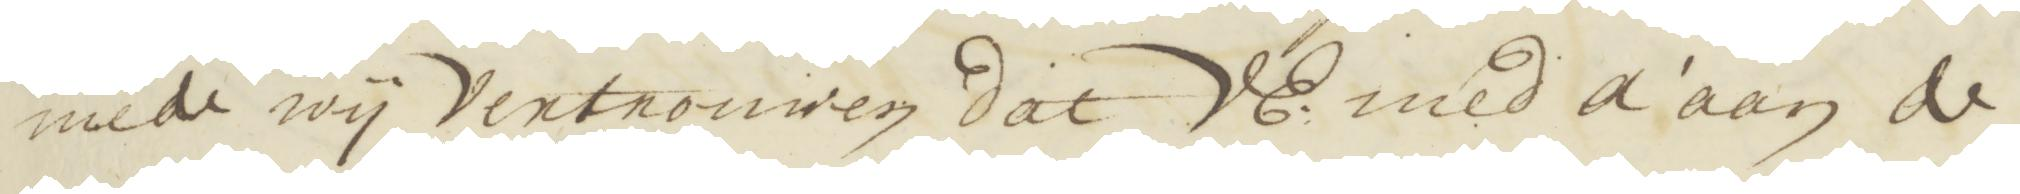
mede wij vertrouwen dat VE: med d'aan de
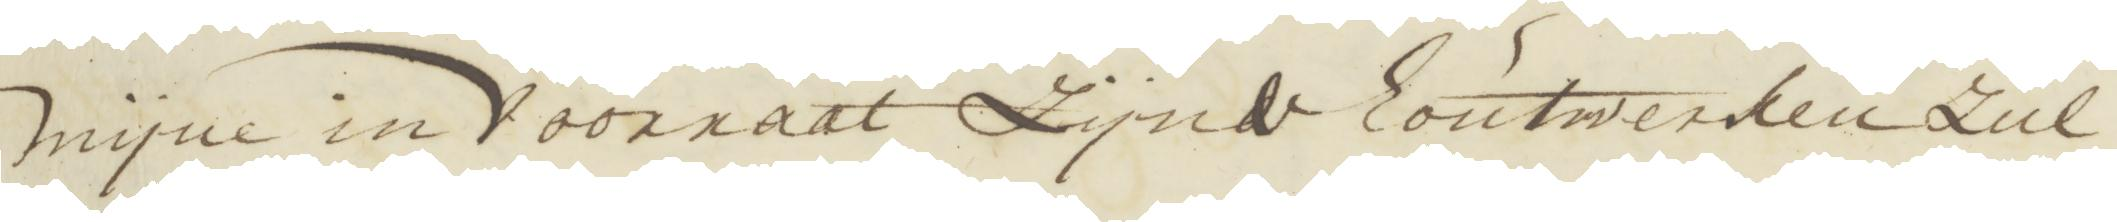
mijne in voorraat Zijnde houtwerken zul
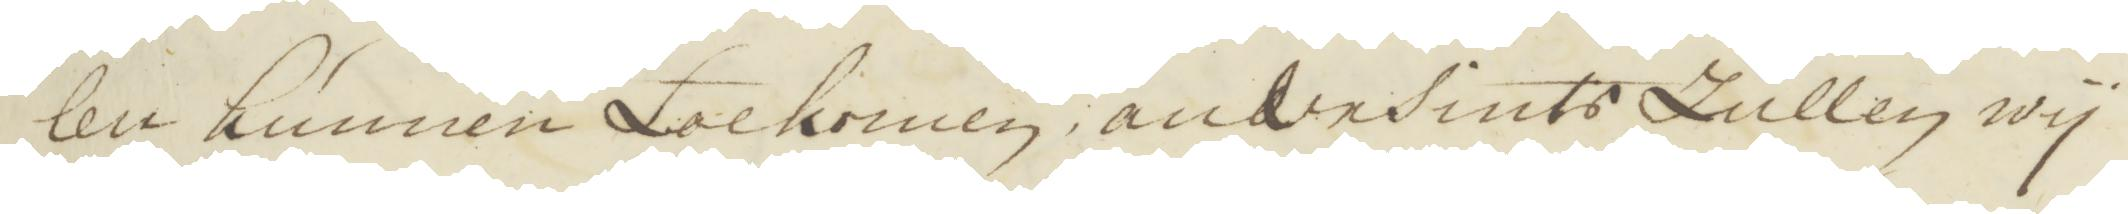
len kunnen toekomen; andersints Zullen wij
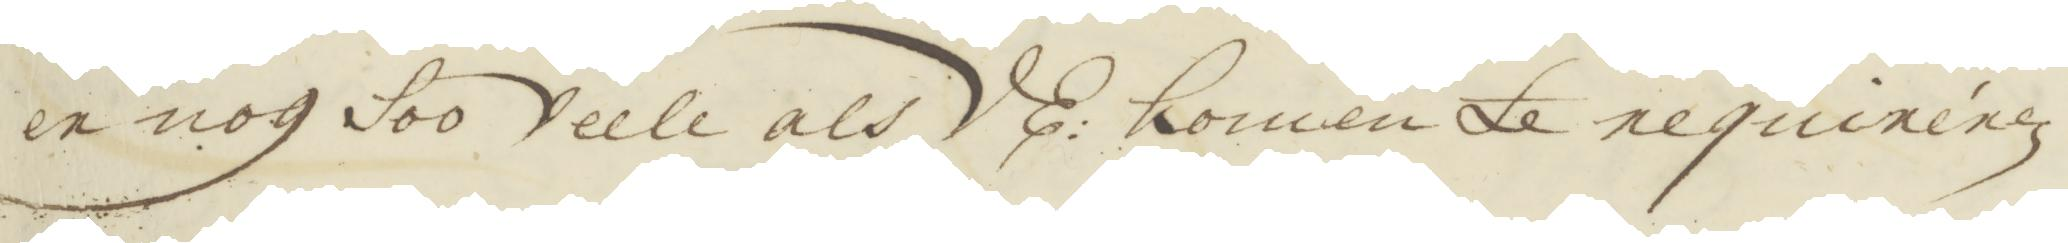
er nog Soo veele als VE: komen te requireren
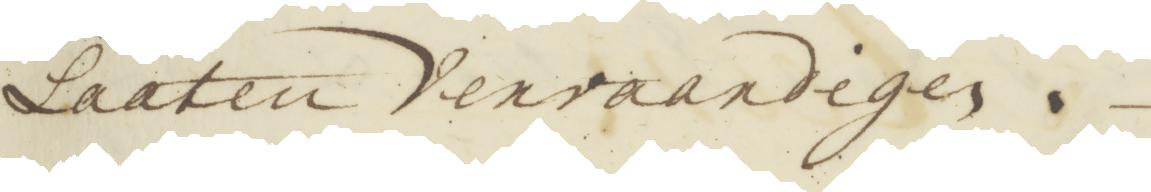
Laaten vervaardigen.
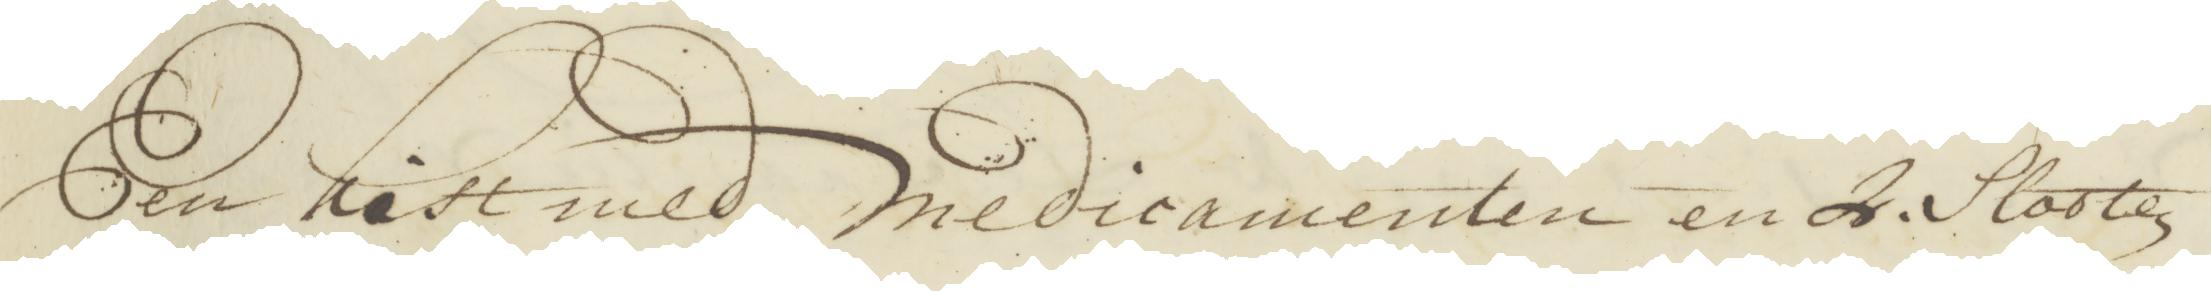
Een kist med medicamenten en 2. slooten,
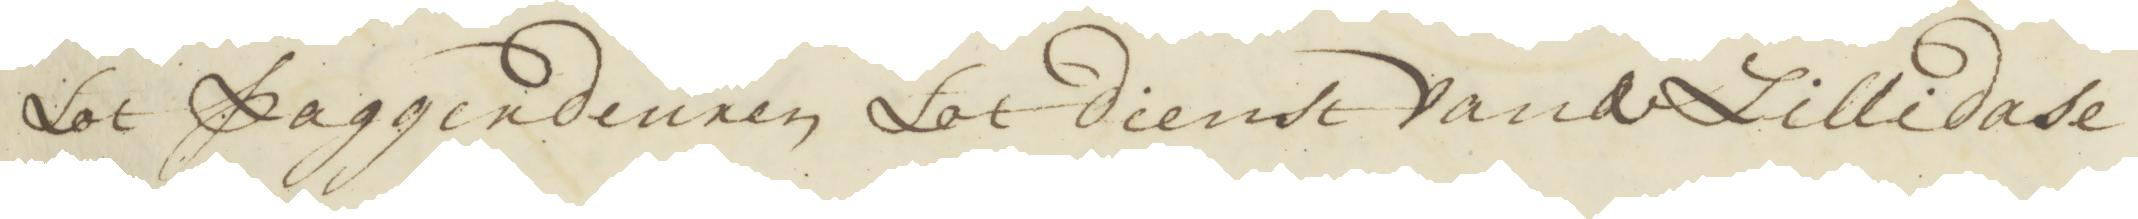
tot paggerdeuren tot dienst vande Zilledase
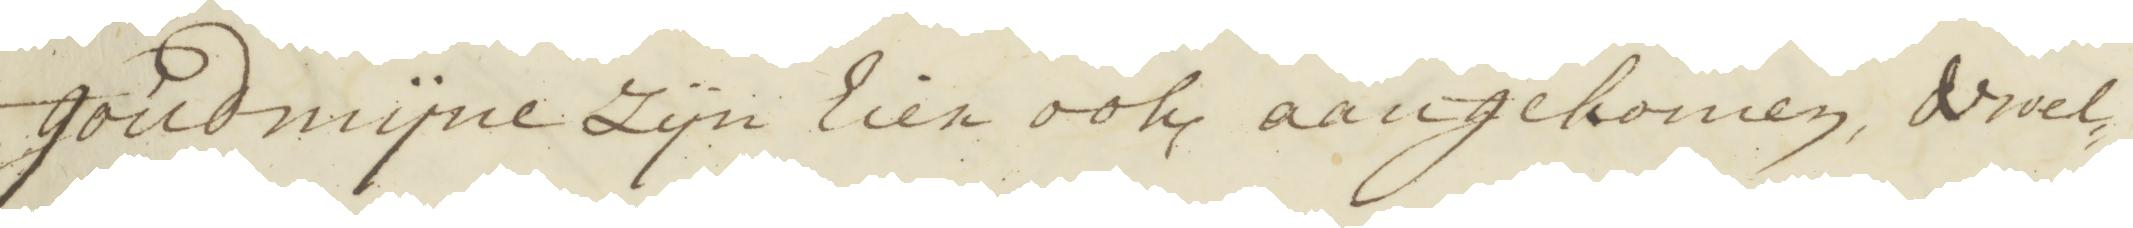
goudmijne zijn hier ook aangekomen, dewel„
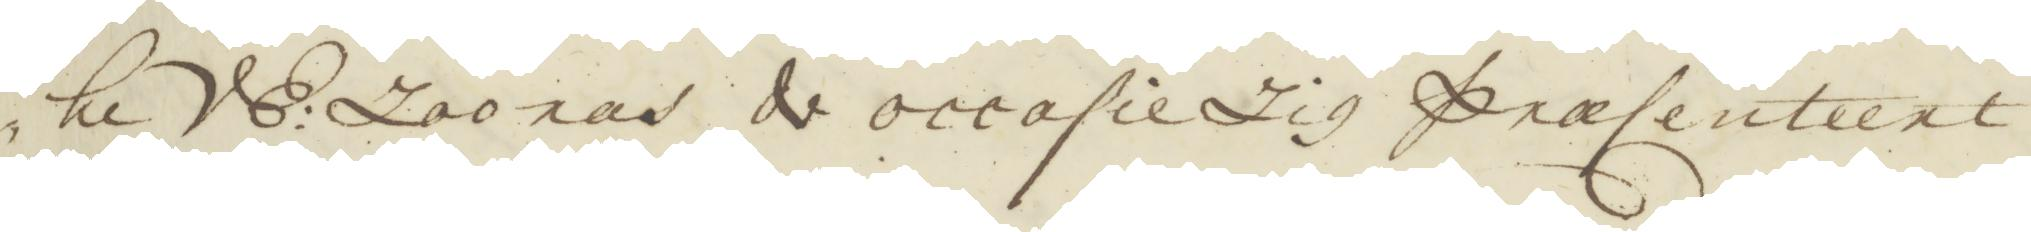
„ke VE: zoo ras de occasie zig praesenteert
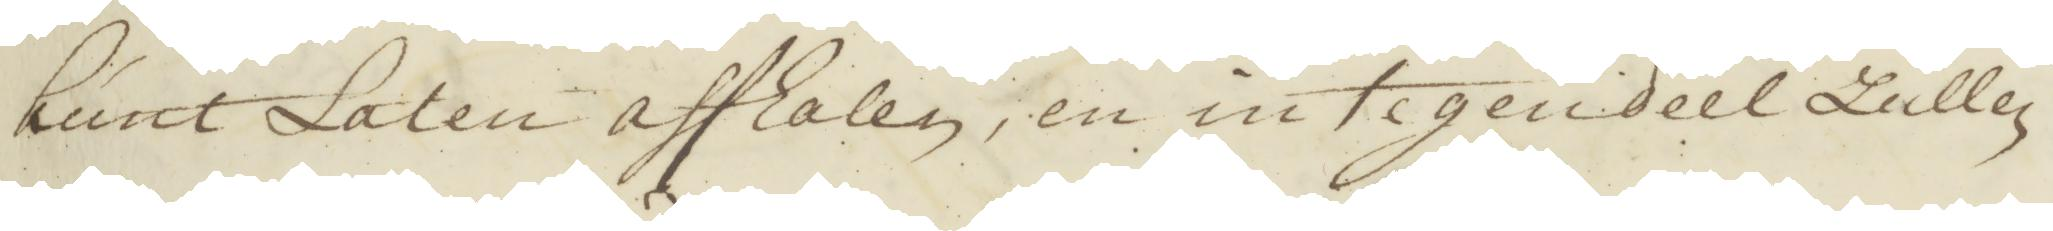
kunt Laten affhalen; en in tegendeel zullen
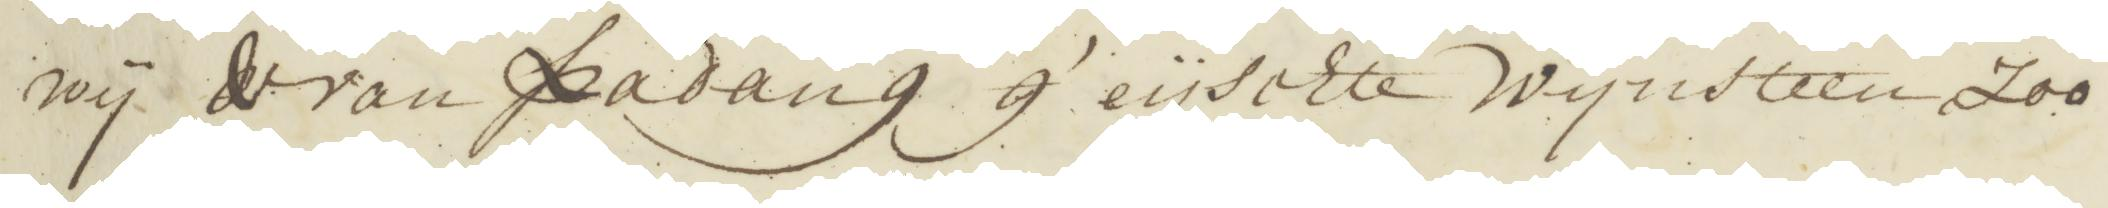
wij de van Padang g’ eijschte wijnsteen zoo
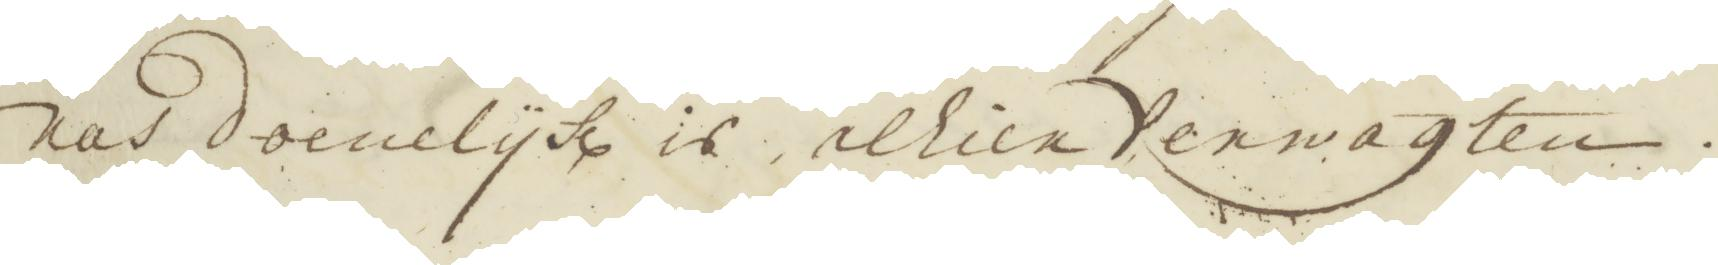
ras doenelijk is alhier Verwagten.
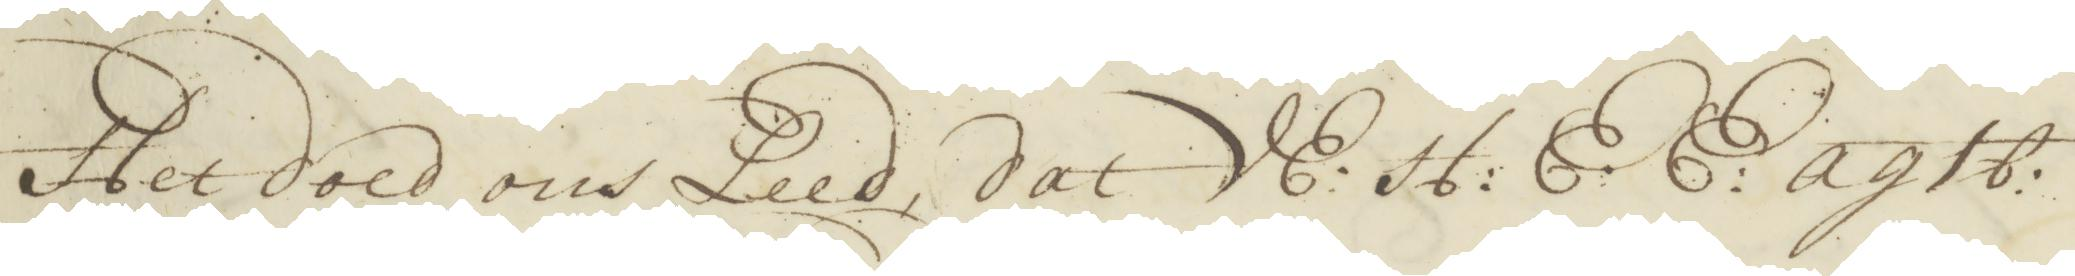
Het doed ons Leed, dat VE: H: E: E: Agtb:
